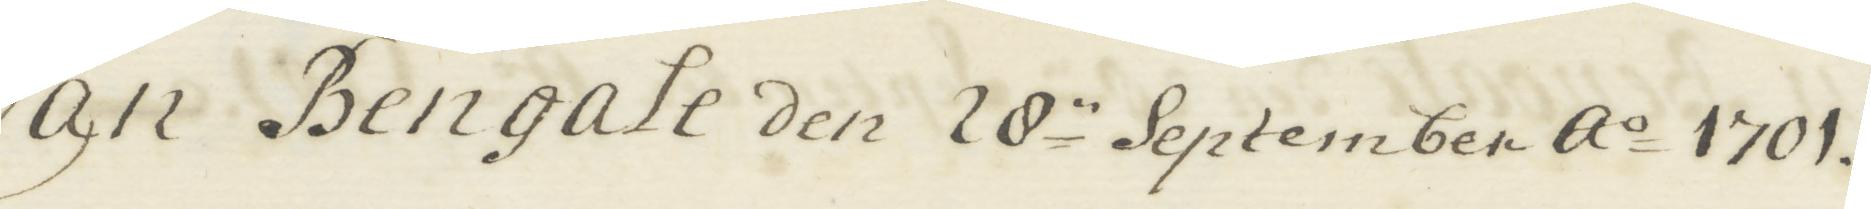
Van Bengale den 28=n September A=o 1701.
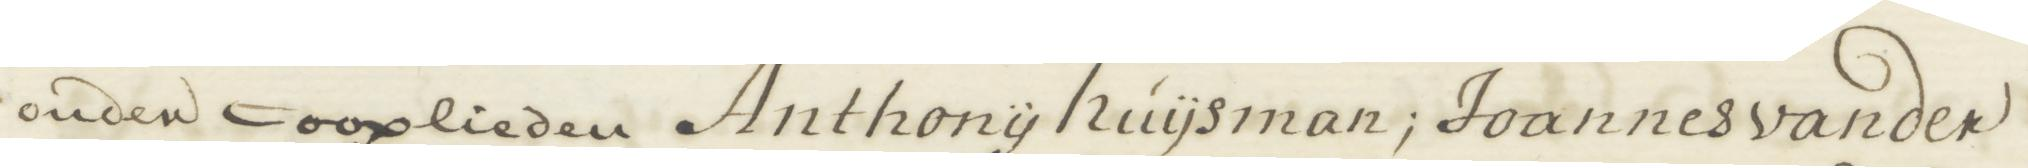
onder cooplieden Anthonij huijsman; Ioannes van der
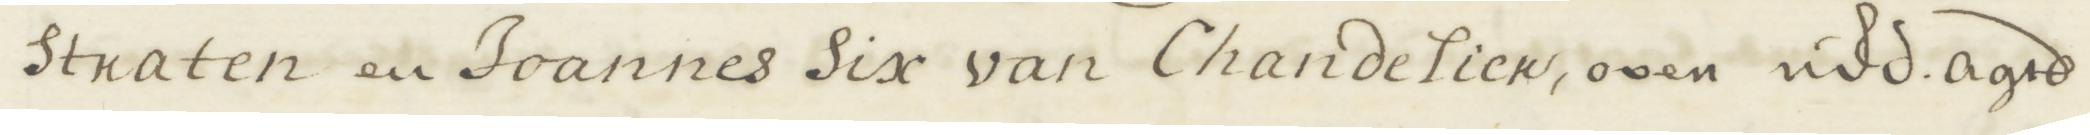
straten en Ioannes six van Chandelier, over uEd. agtb
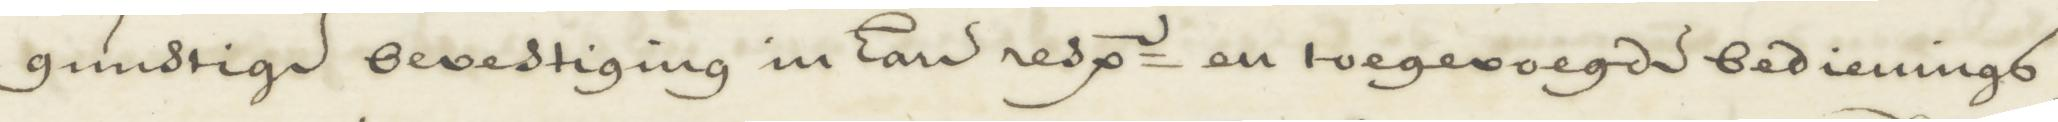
gunstige bevestiging in hare resp=e en toegevoegde bedienings,
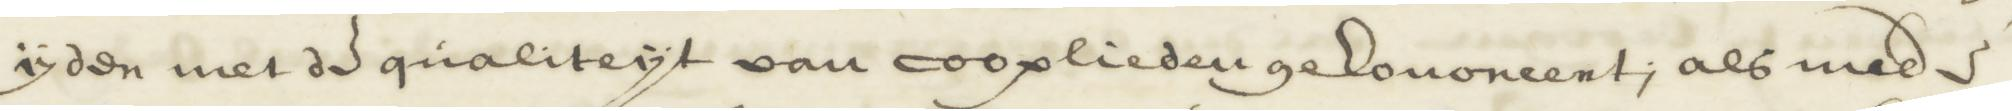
ijder met de qualiteijt van cooplieden gehonoreert; als mede
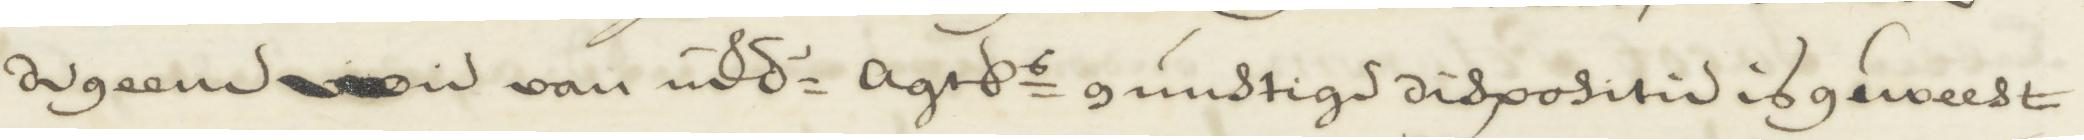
de geene wie van uEd=' agtb=r gunstige dispositie is geweest
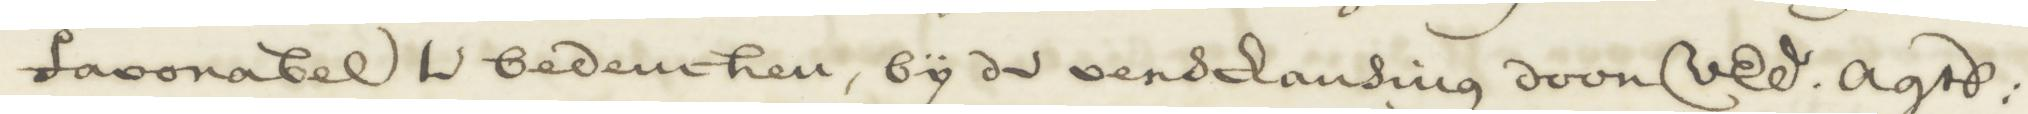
favorabel te bedencken, bij de verschansing door UEd. agtb.
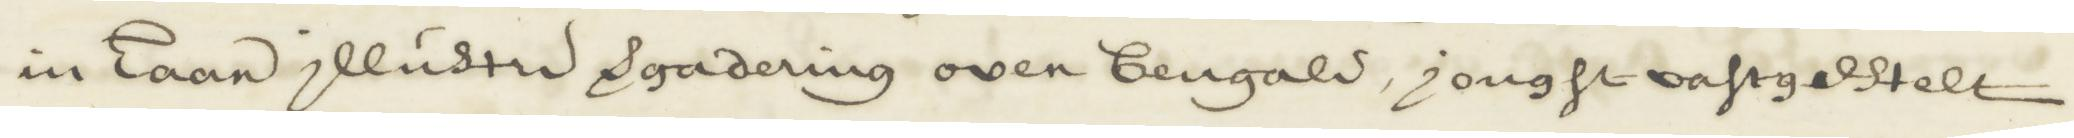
in haar jllustre vergadering over bengale, jongst vastgestelt,
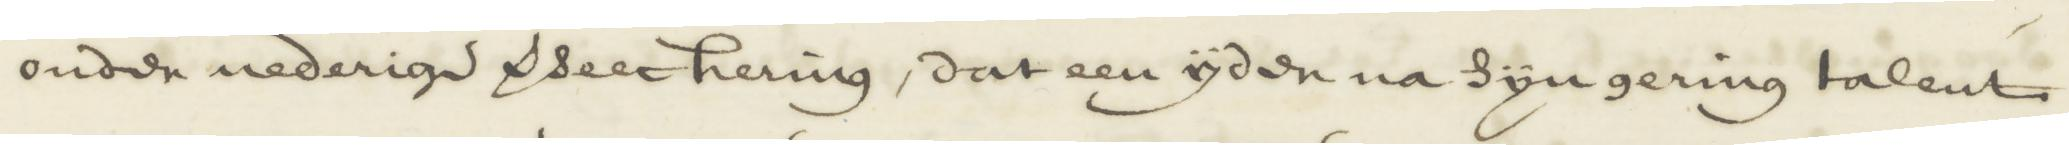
onder nederige verseeckering, dat een ijder na sijn gering talent,
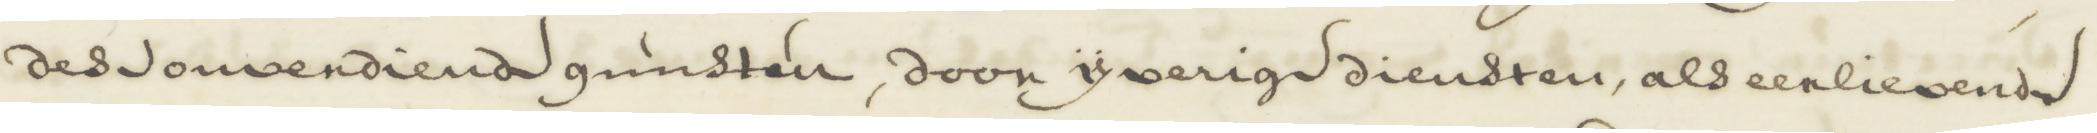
dese onverdiende gunsten, door ijverige diensten, als eerlievende
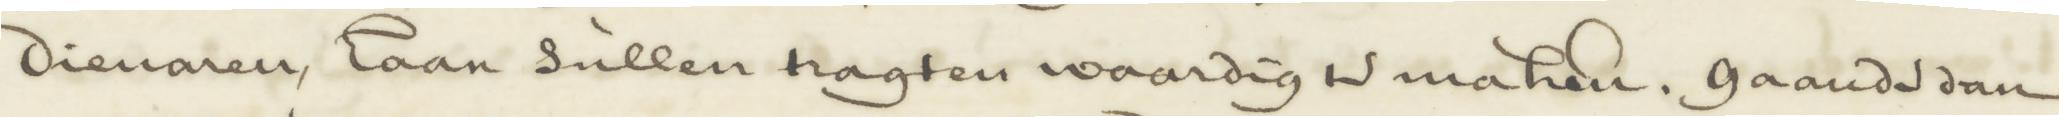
dienaren, haar sullen tragten waardig te maken. gaande dan
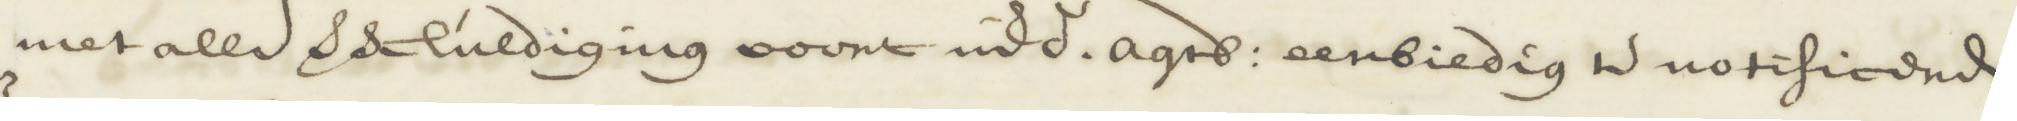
met alle verschuldiging voort uEd. agtb: eerbiedig te notificeren
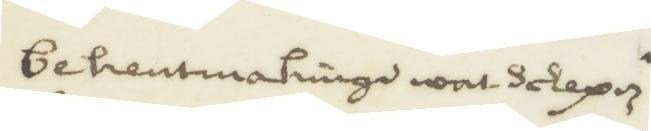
bekentmakinge wat schepen
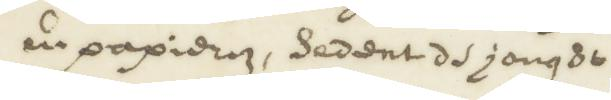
en papieren, sedert de jongst
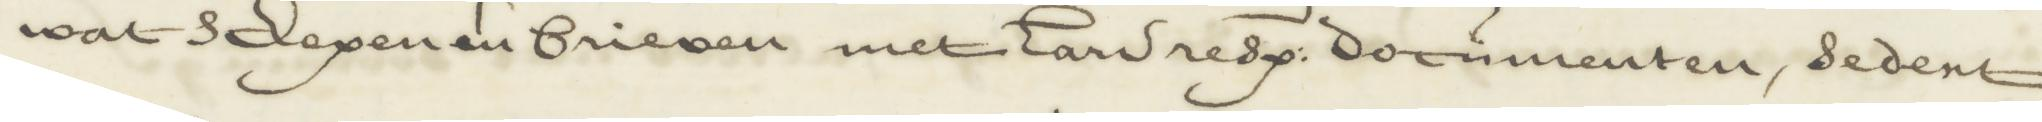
wat schepen en brieven met hare resp: documenten, sedert
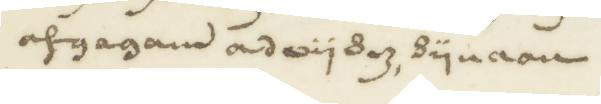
afgegane advijsen, sijn aan
